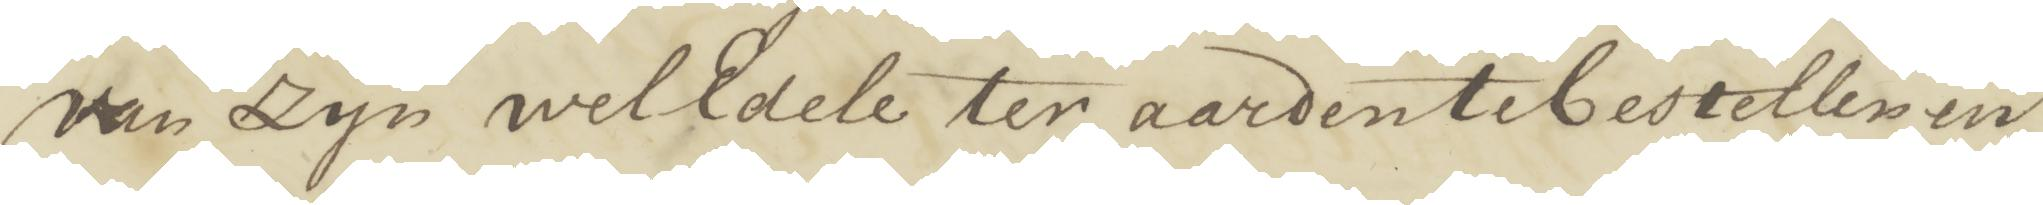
van zijn wel Edele ter aarden te bestellen en
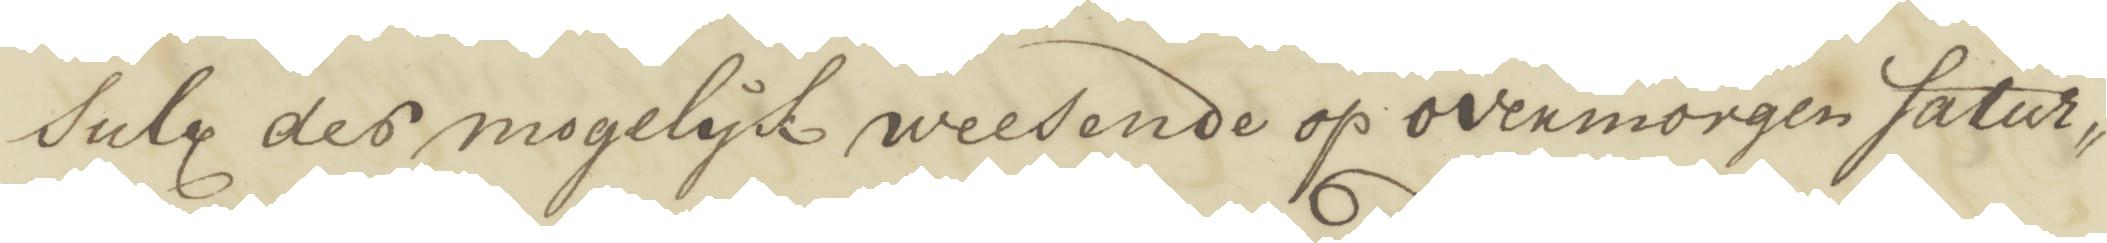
sulx des mogelijk weesende op overmorgen satur„
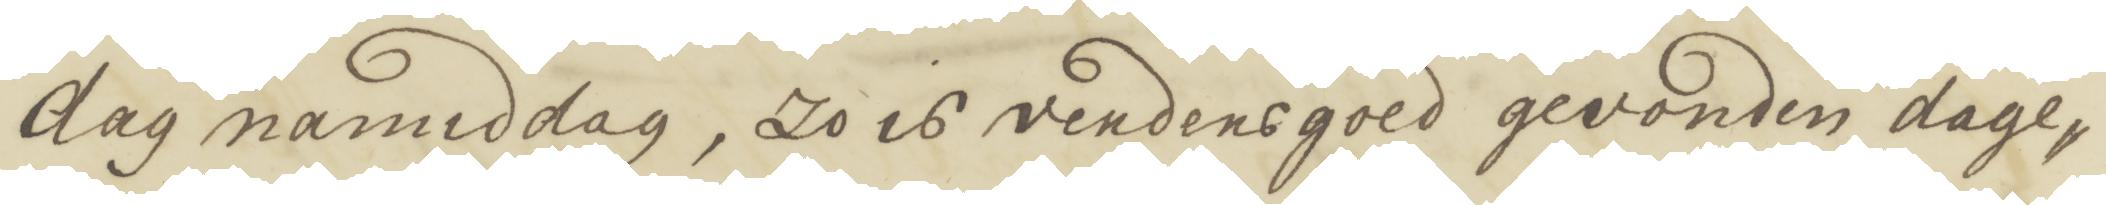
dag namiddag, zo is verders goed gevonden dage„
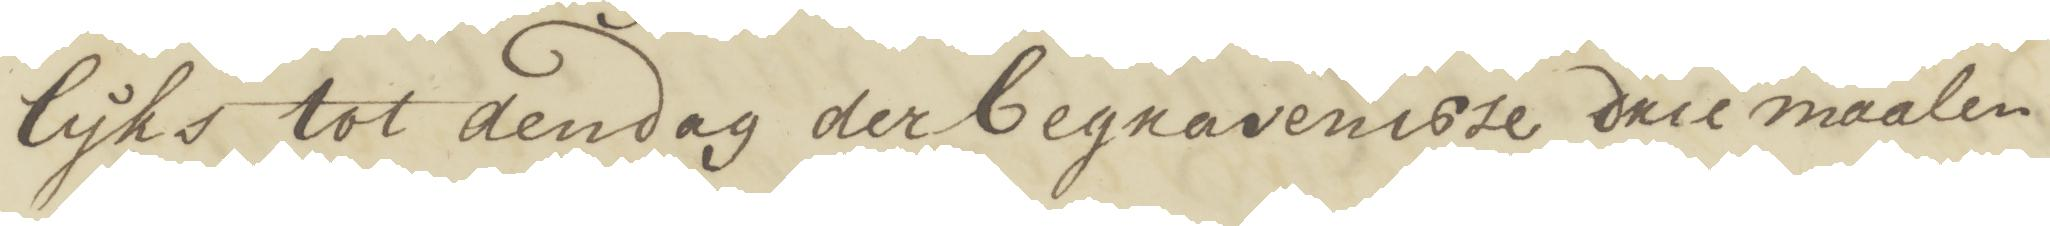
lijks tot den dag der begravenisse drie maalen
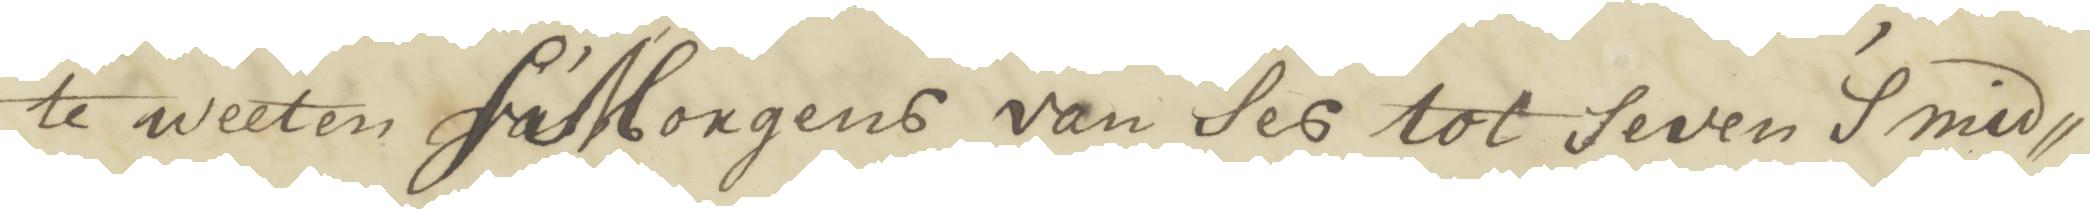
te weeten s'Morgens van ses tot seven 's mid„
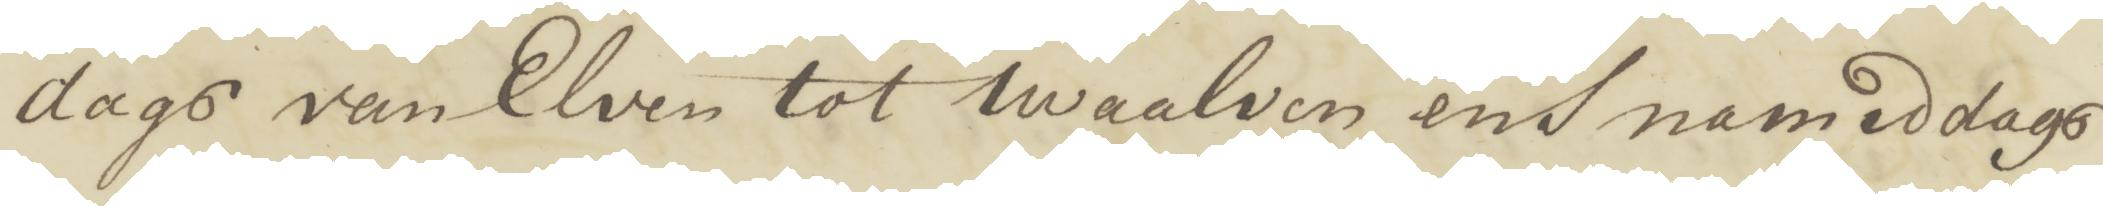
dags van Elven tot twaalven en's namiddags
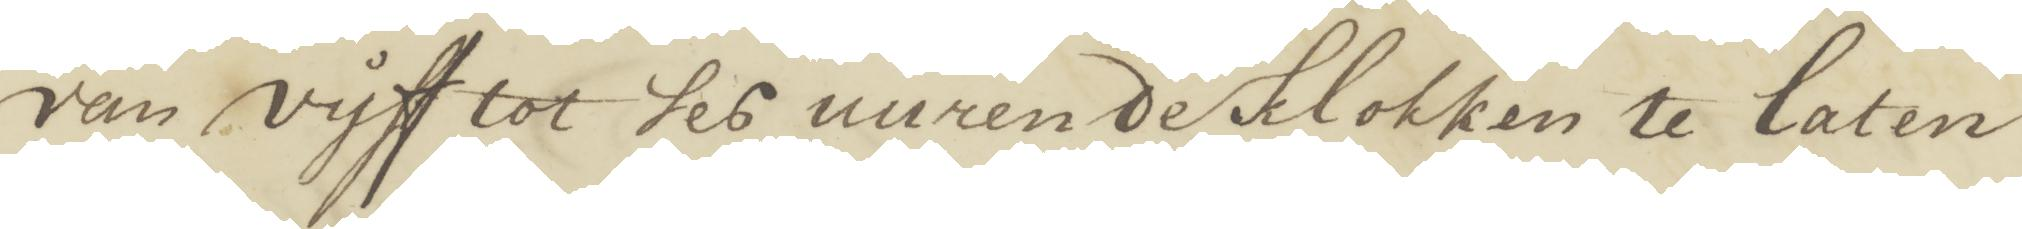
van vijff tot ses uuren de klokken te laten
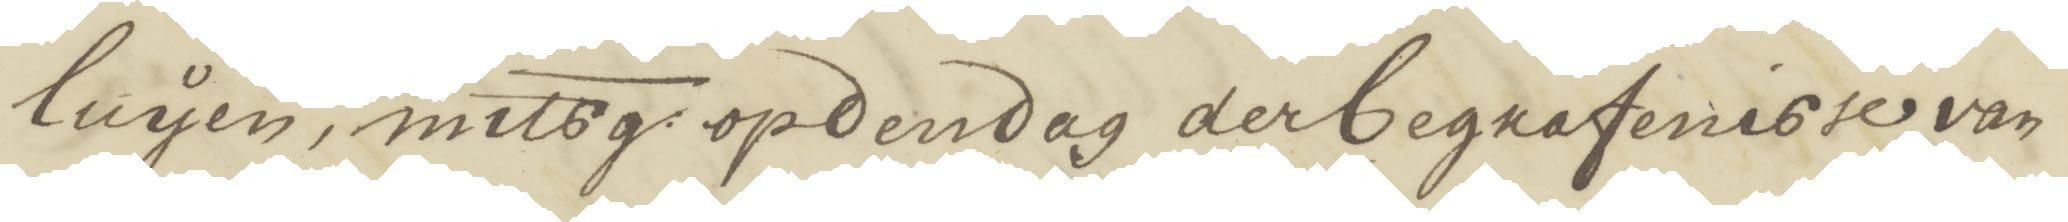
luijen, mitsg: op den dag der begrafenisse van
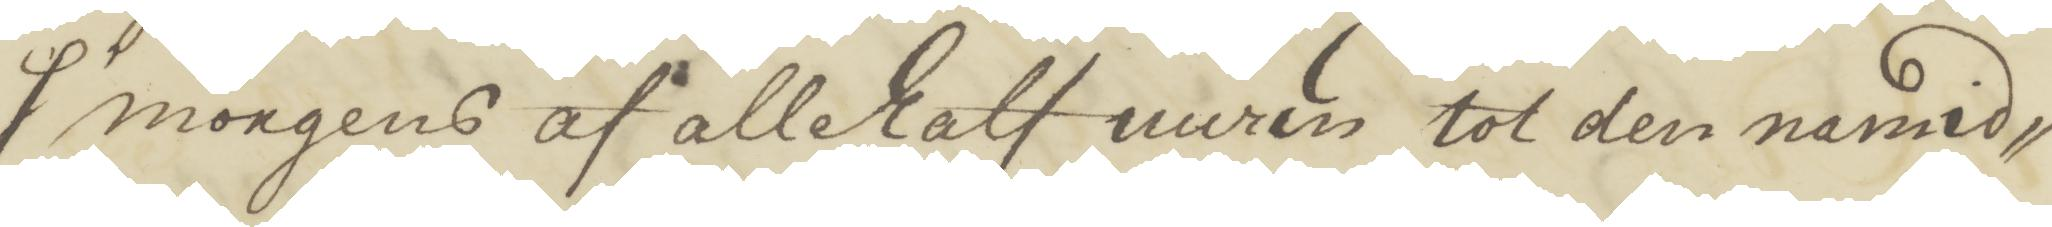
s' morgens af alle half uuren tot den namid„
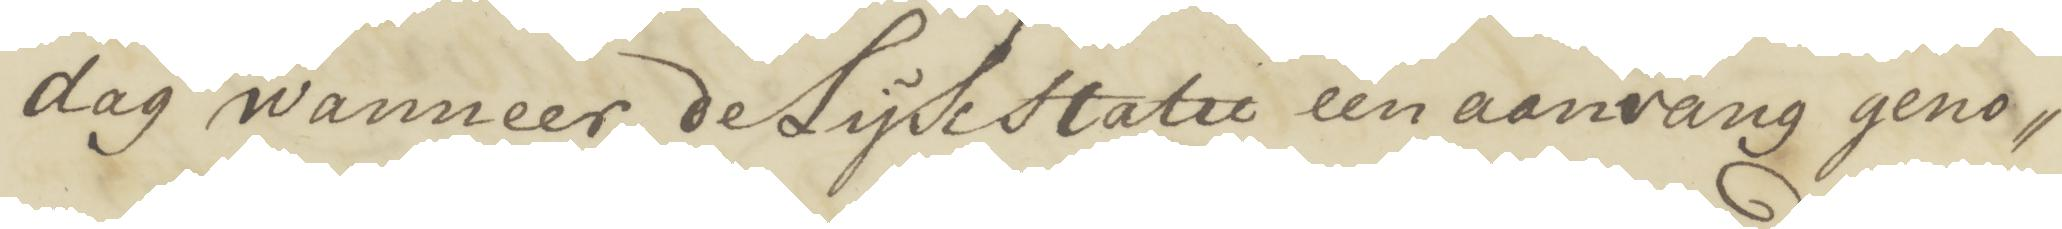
dag wanneer de Lijkstatie een aanvang geno„
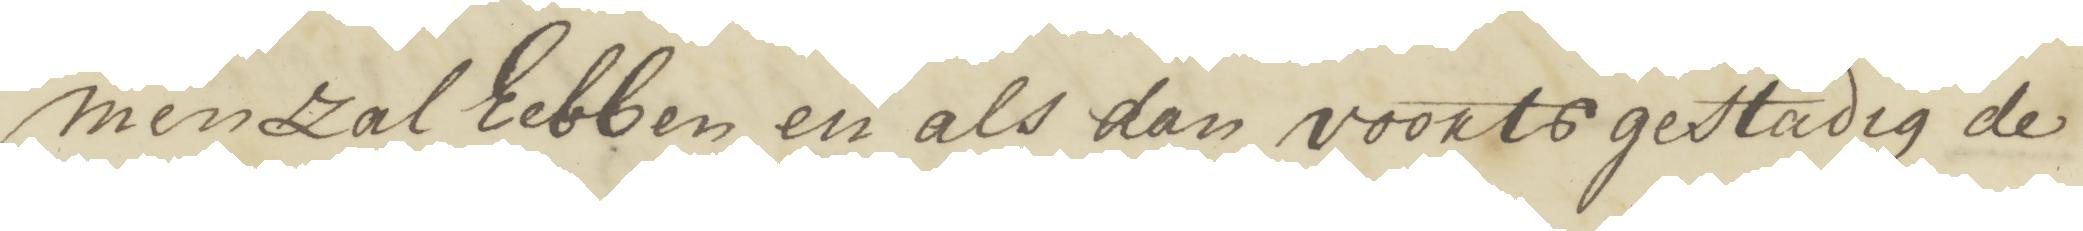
men zal hebben en als dan voorts gestadig de
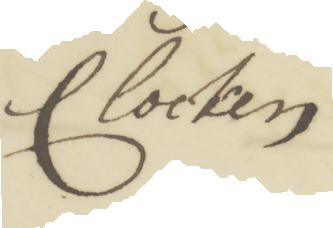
Clocken
